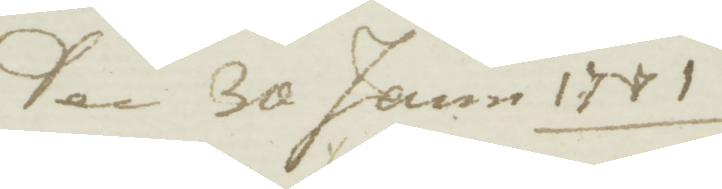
den 30 Janu 1771
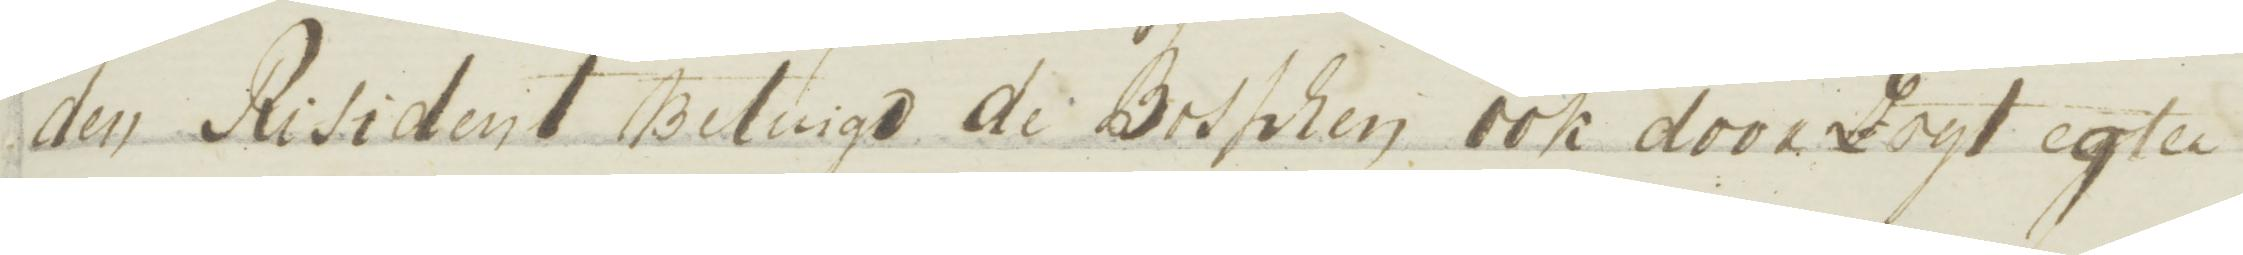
den Risident Betuigd de Bosschen ook door Zogt egter
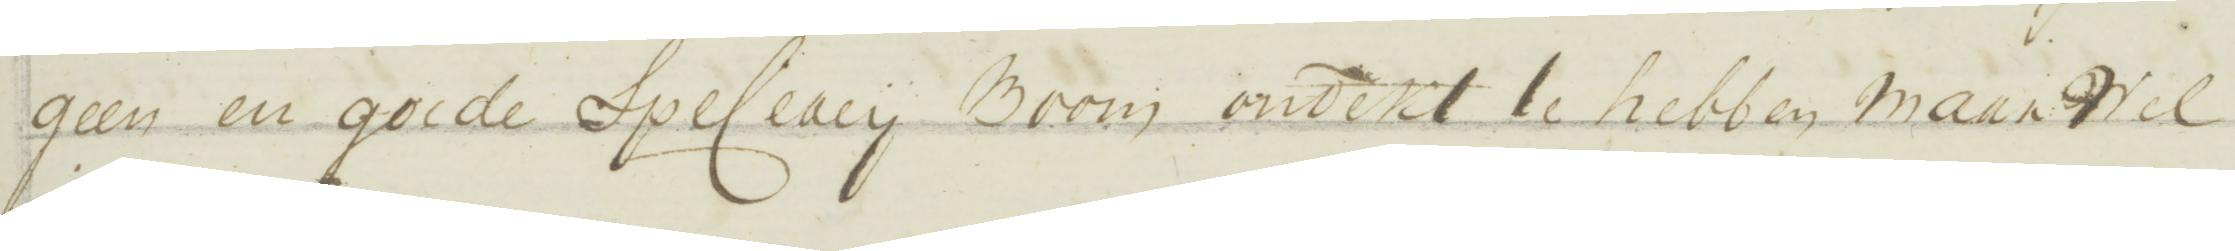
geen en goede specereij Boom ondekt te hebben maar Wel
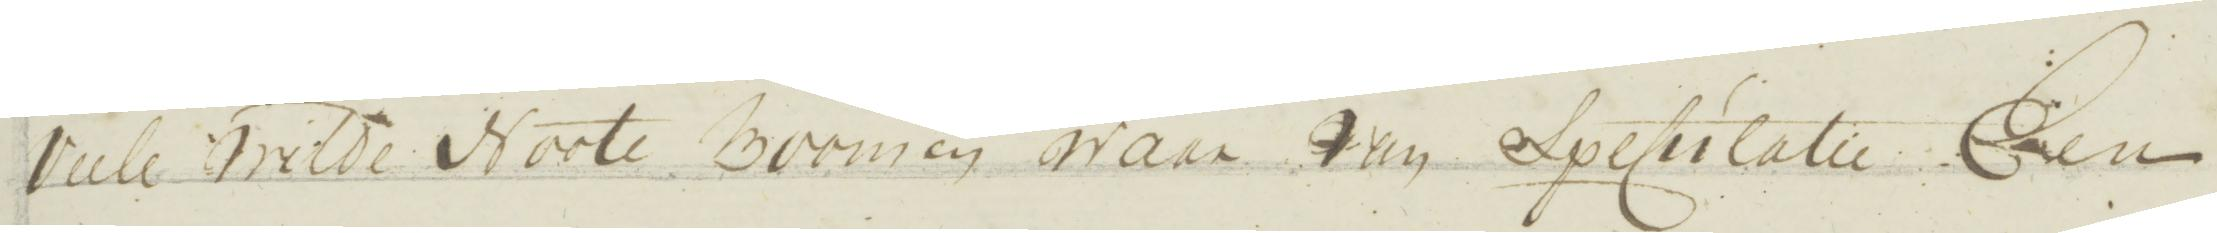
veele wilde Noote Boomen waar van speculatie Een
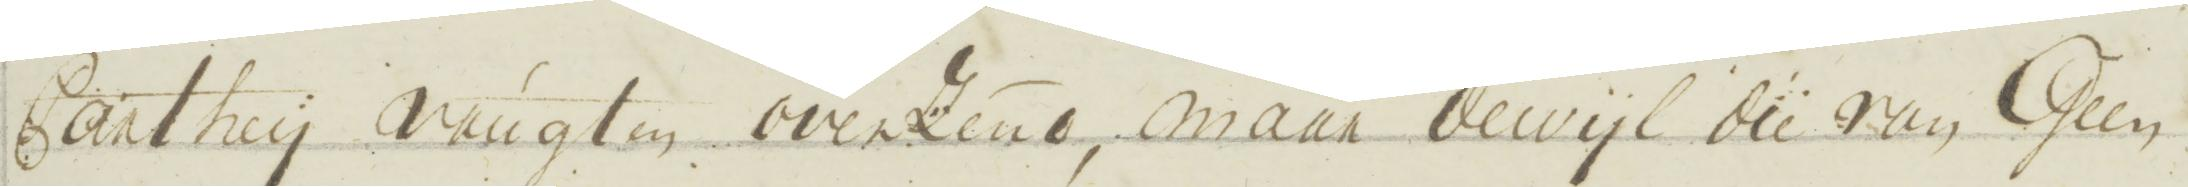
Partheij vrugten overzend, maar dewijl die van Geen
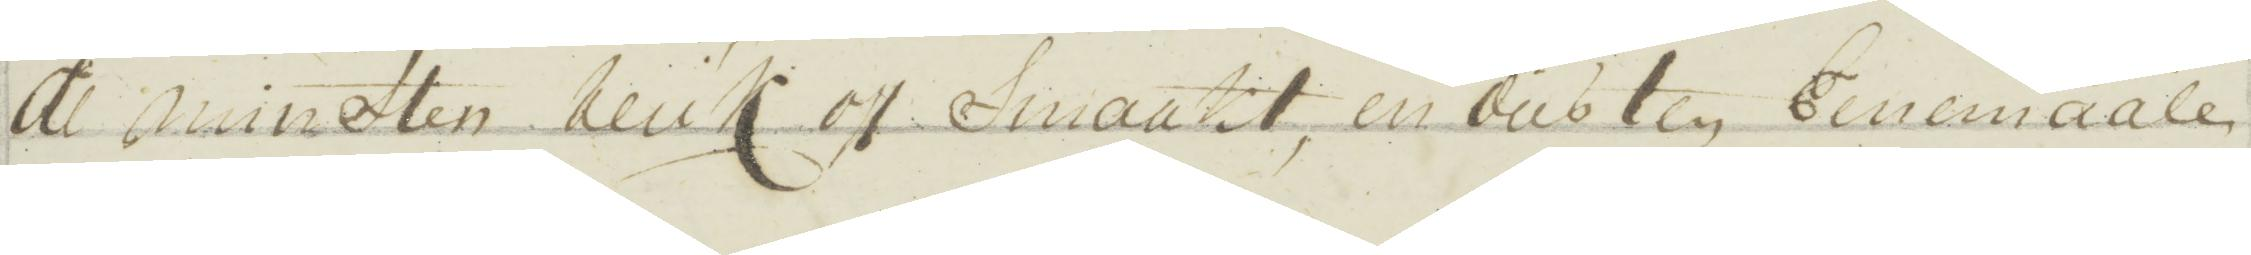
de minsten reuk of Smaakt, en dus ten Eenemaale
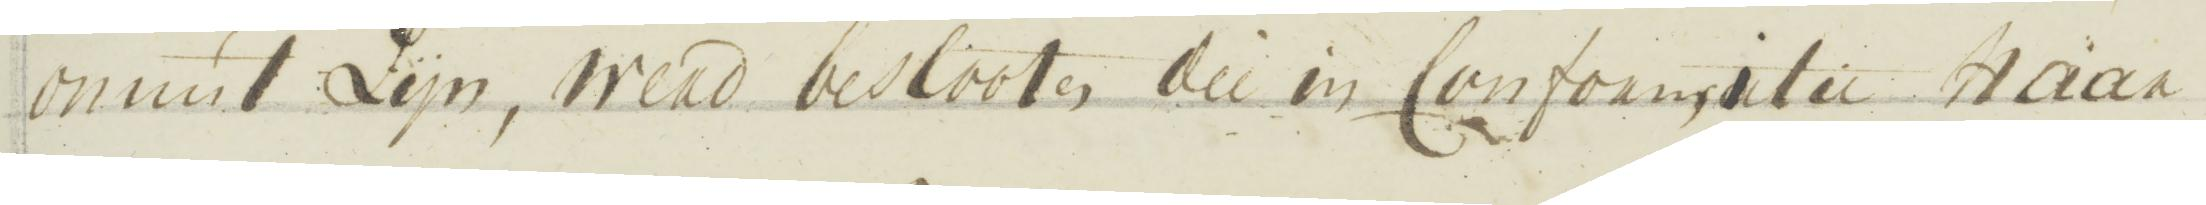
onnut zijn, werd beslooten die in Conformatie haar
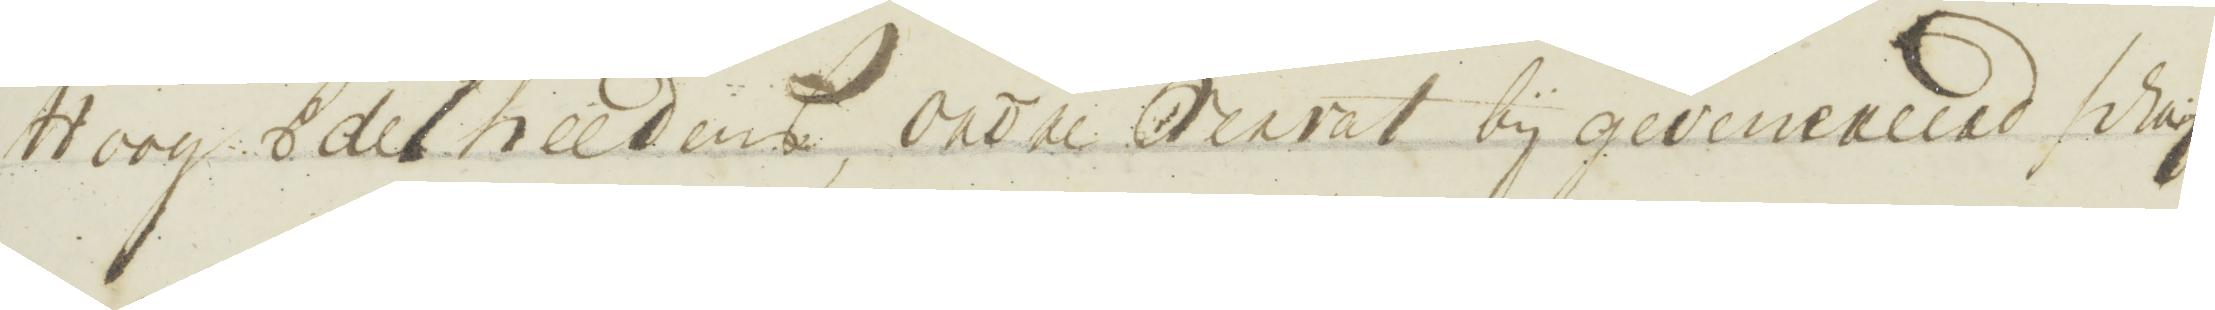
Hoog: Edelheedens, ordre Vervat bij gevenereerd schrij
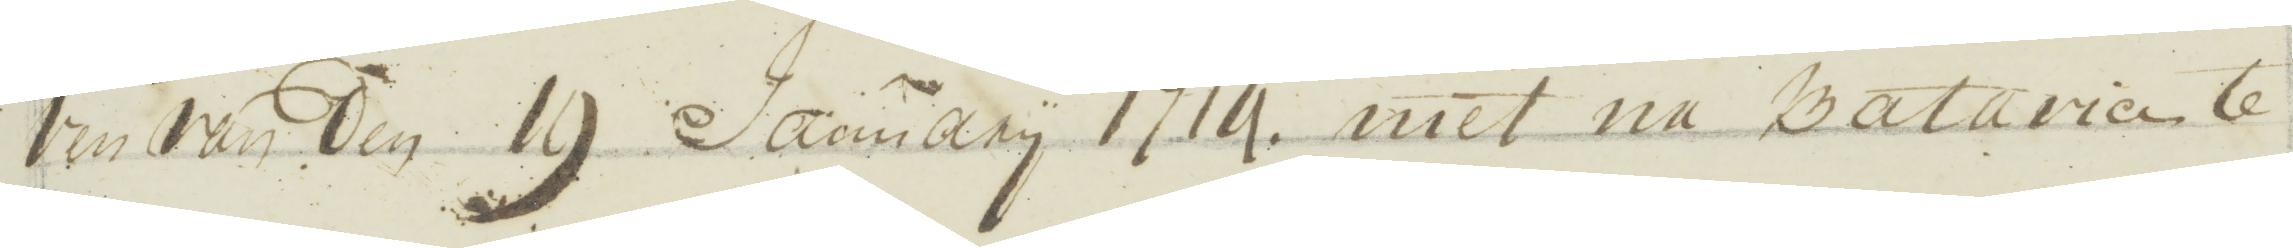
ven van den 19 Januarij 1714. niet na Batavia te
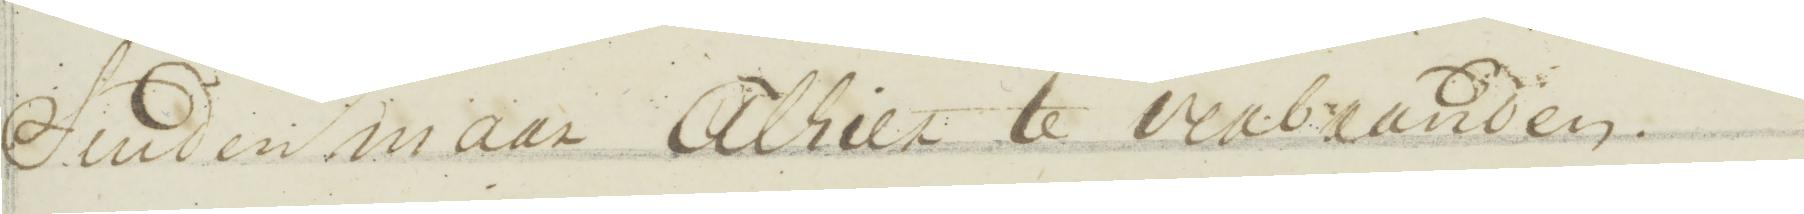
senden maar Alhier te verbranden.
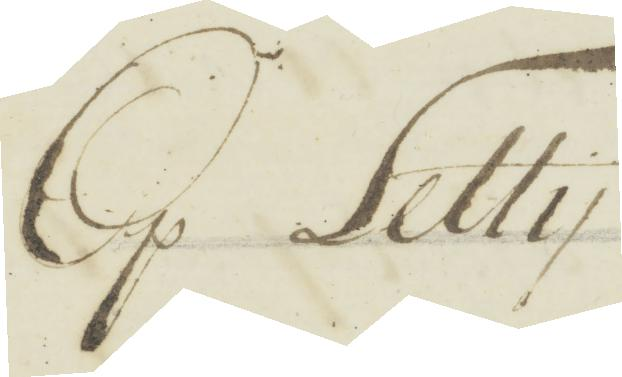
Op Settij
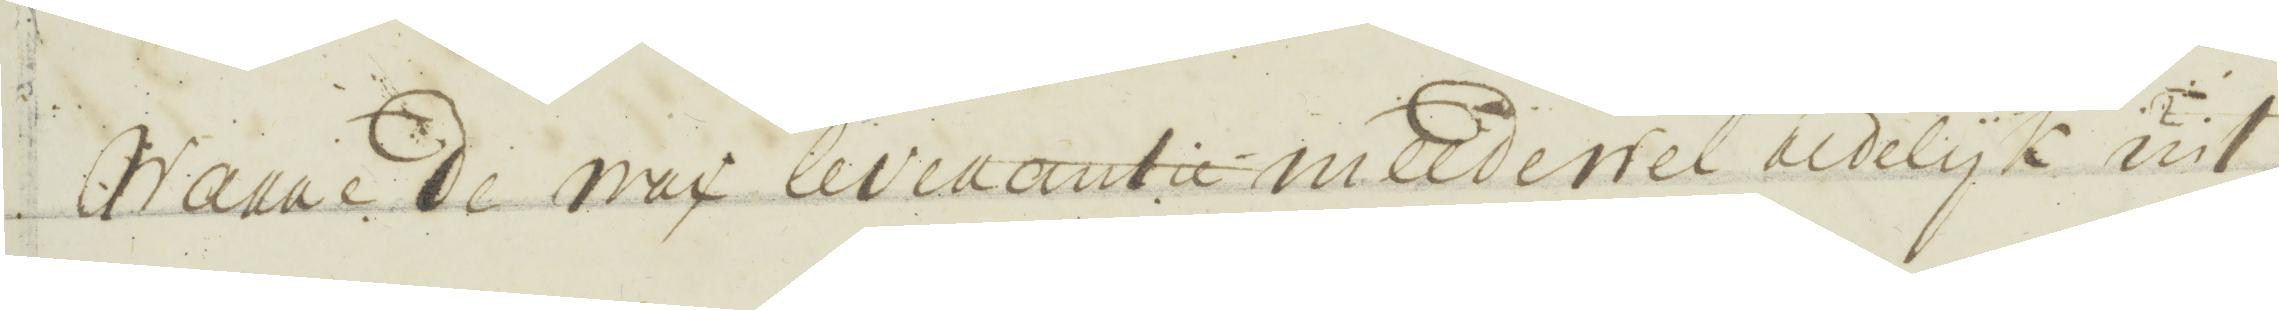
Warre de wax leverantie meede wel redelijk uit
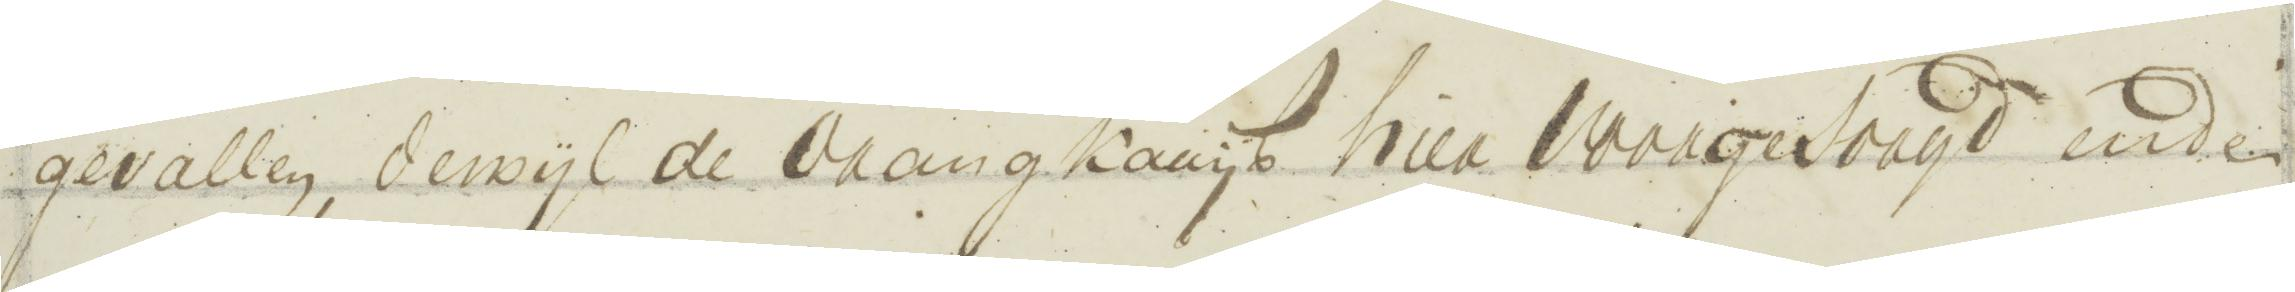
gevallen, dewijl de Orangkarijs hier voorgesorgd en den
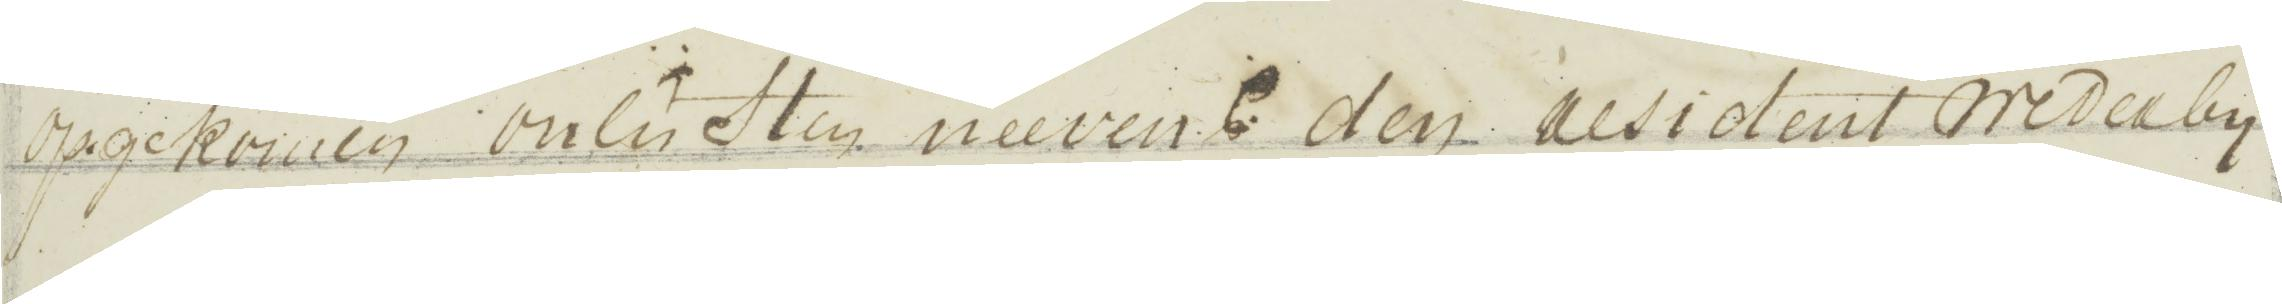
opgekomen onlusten neevens den resident wederby
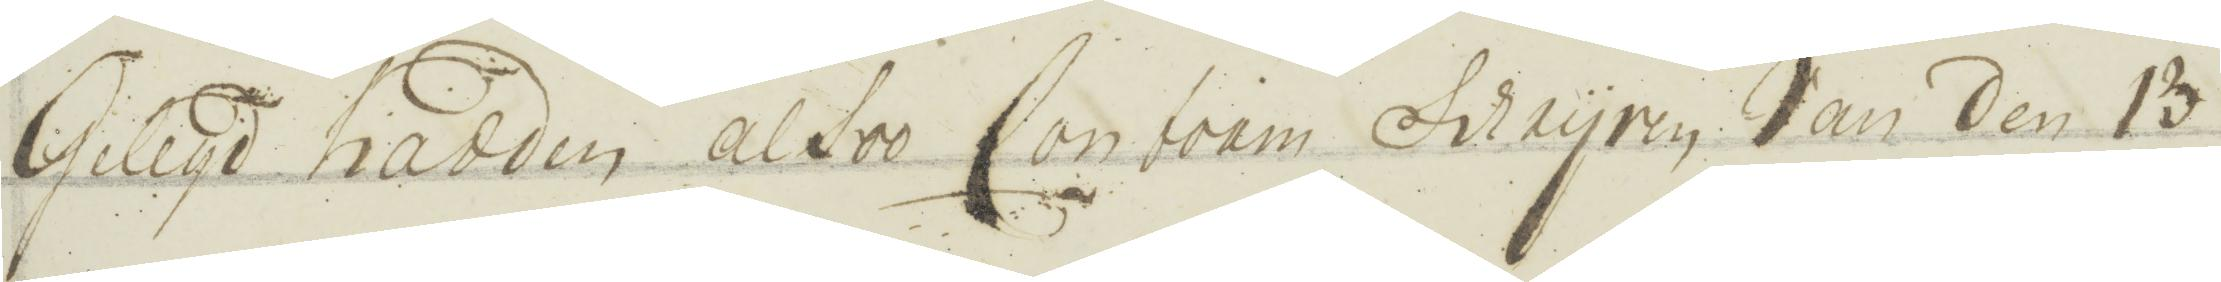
Gelegd hadden alsoo Conform schrijven Van den 13
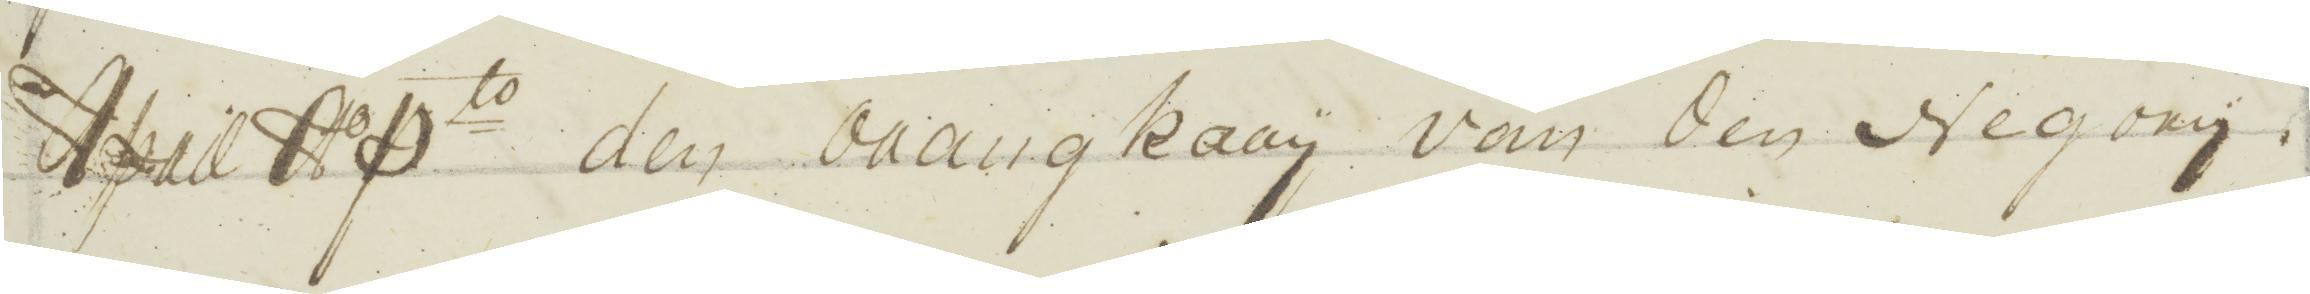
April Ao P=to den Orangkaaij van den Negorij,
